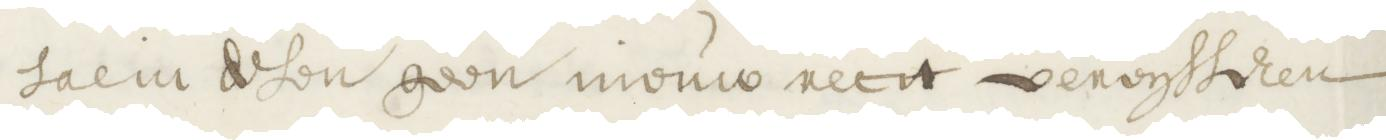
salin desen geen nieuw recit vereijsschen
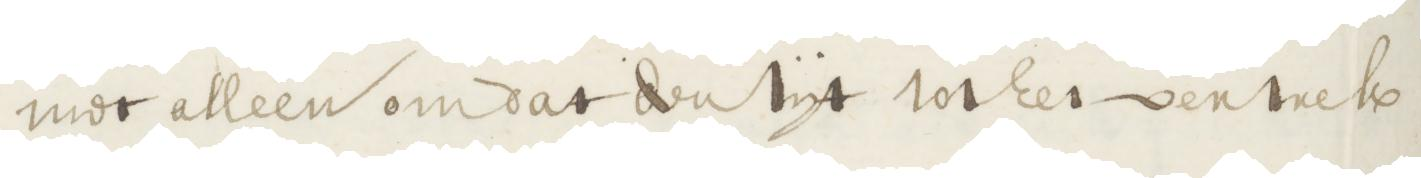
niet alleen om dat den tijt tot het vertrek
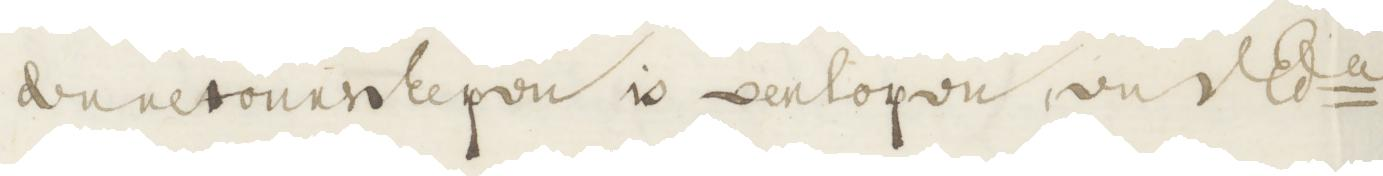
der retourschepen is verlopen, en UEd=en
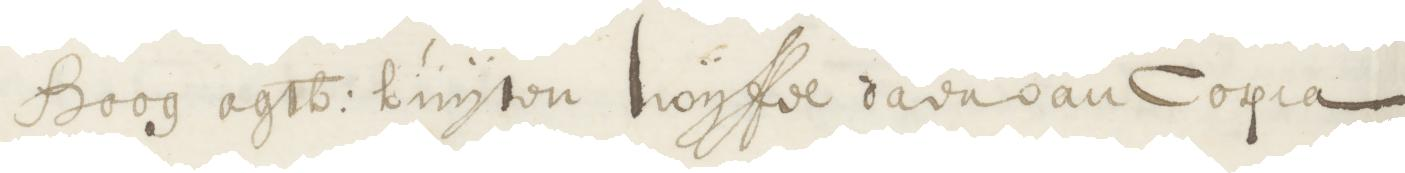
Hoog agtb: buijten twijffel daer van Copia
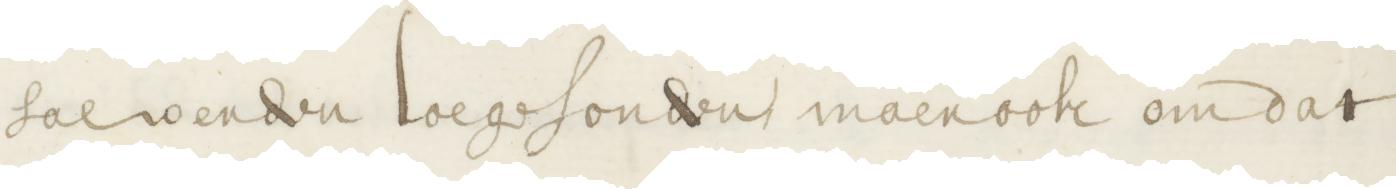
sal werden toegesonden, maer ook om dat
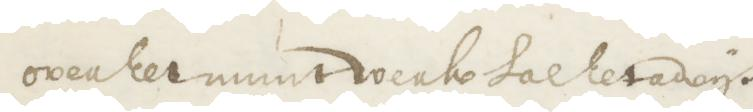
over het muntwerk sal het advijs
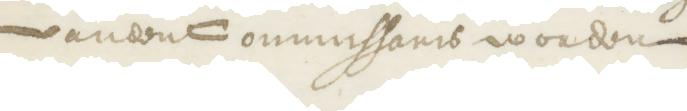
vanden Commissaris worden
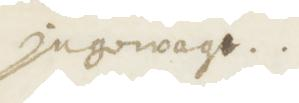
ingewagt.
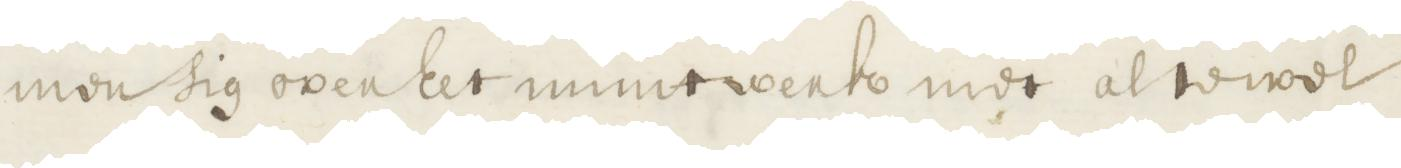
men sig over het muntwerk niet alte wel
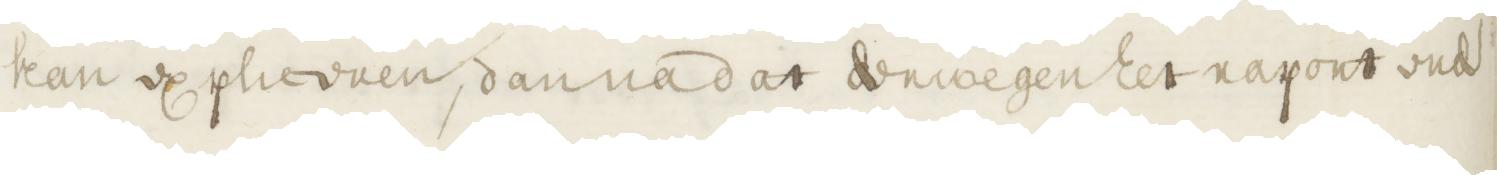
kan expliceren, dan nadat derwegen het raport ende
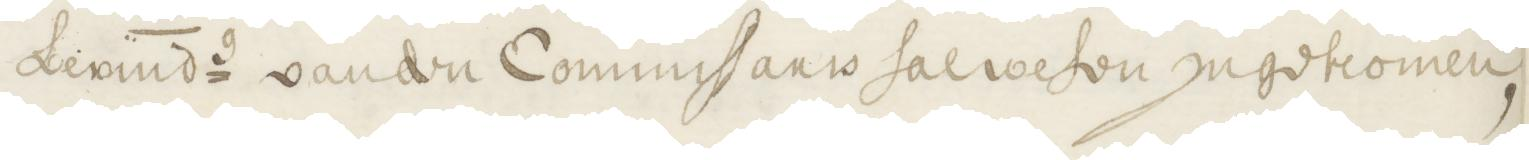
Bevind=g van den Commissaris salwesen ingekomen,
